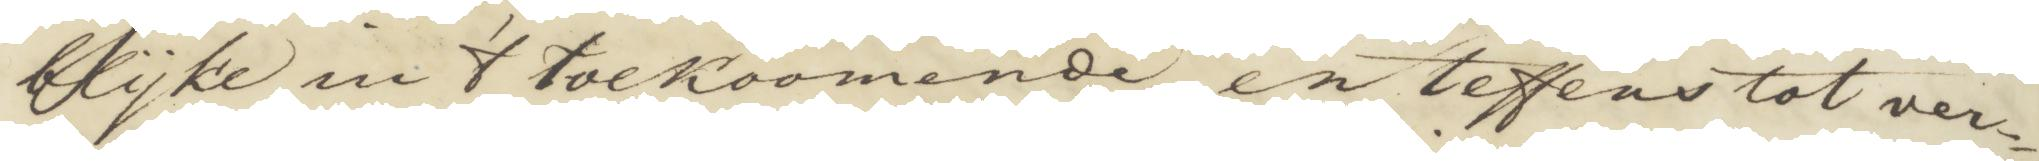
blijke in ’t toekoomende, en teffens tot ver=
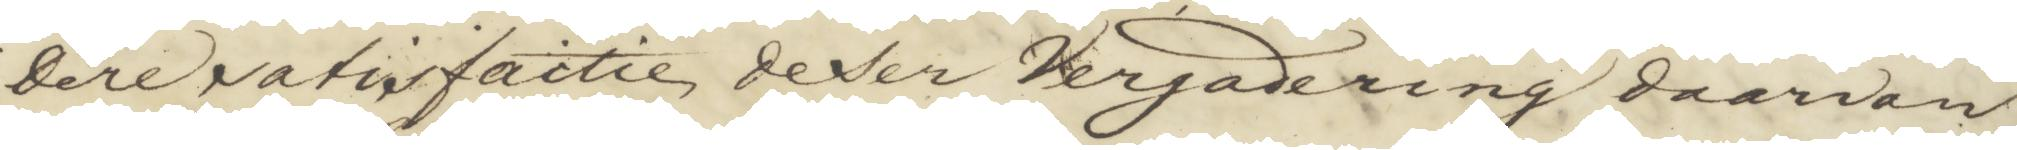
dere satisfactie deser vergadering daarvan
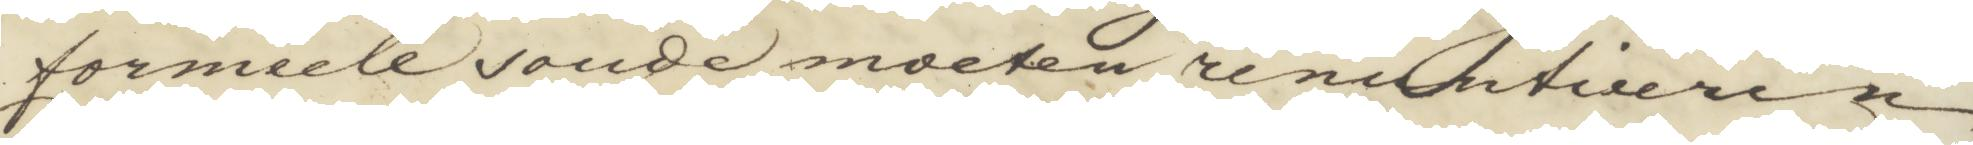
formeele soude moeten renuntieeren.
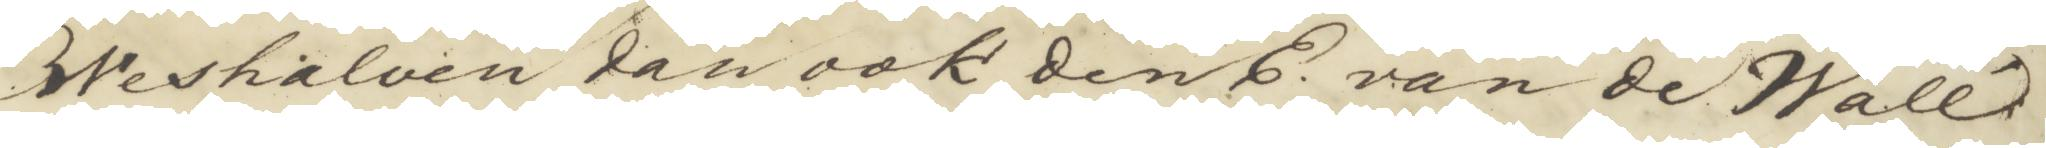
Weshalven dan ook den E. van de Wall
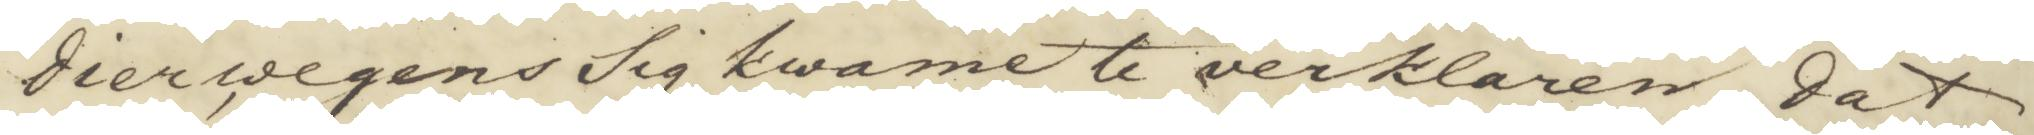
dier wegens sig kwame te verklaren, dat
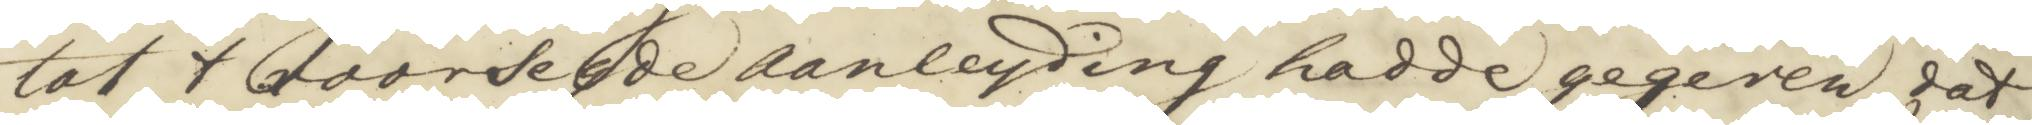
tot ’t voorsegde aanleyding hadde gegeven, dat
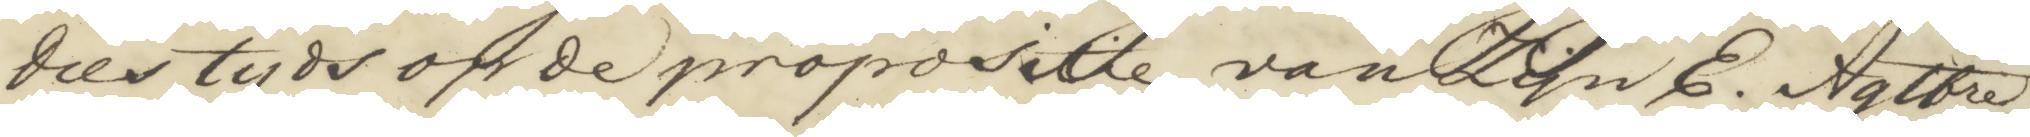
dies tyds op de propositie van zijn E. Agtb=re
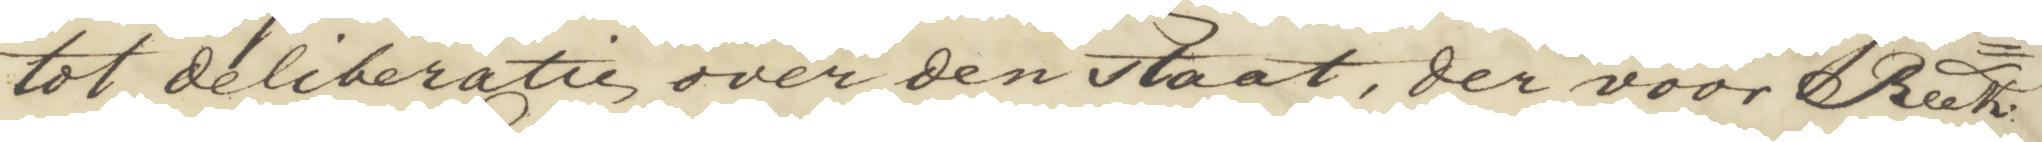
tot deliberatie over den staat, der voor Reek:
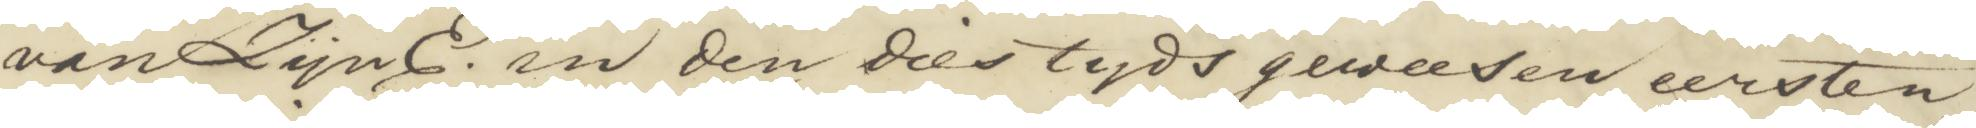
van zijns E. in den dies tyds geweesen eersten
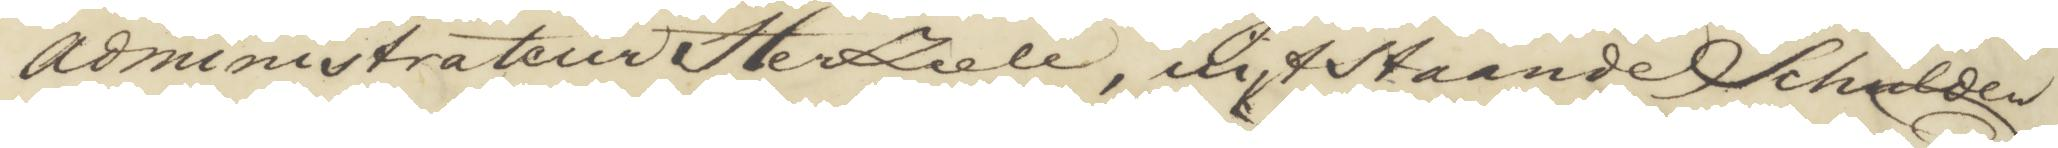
administrateur Herzeele, uijtstaande schulden
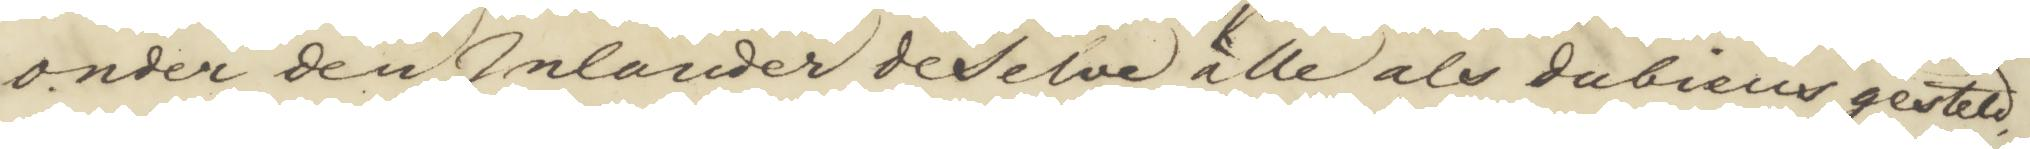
onder den Jnlander deselve alle als dubieus gesteld,
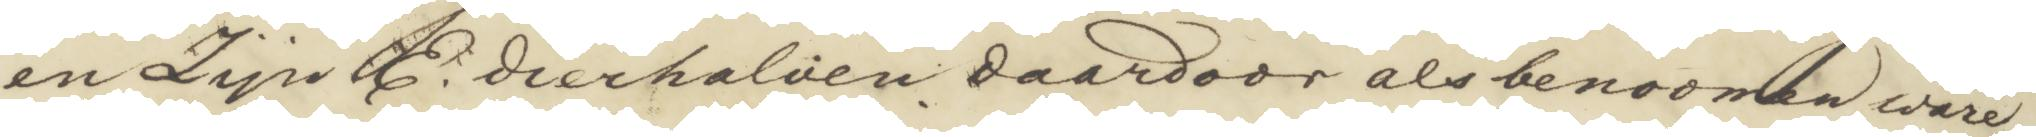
en zijn E: dierhalven daardoor als benoomen ware
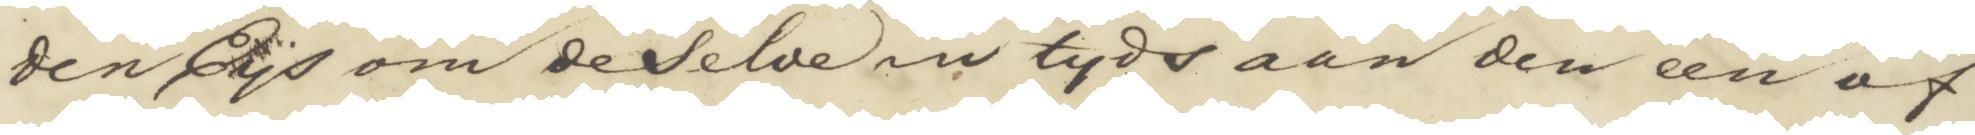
den Eijs om deselve in tyds aan den een of
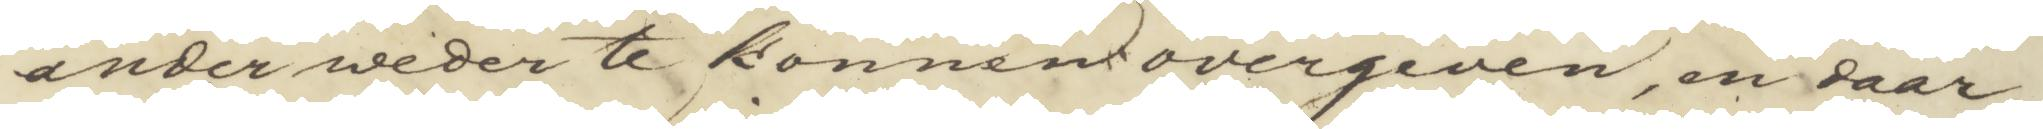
ander weder te konnen overgeven, en daar=
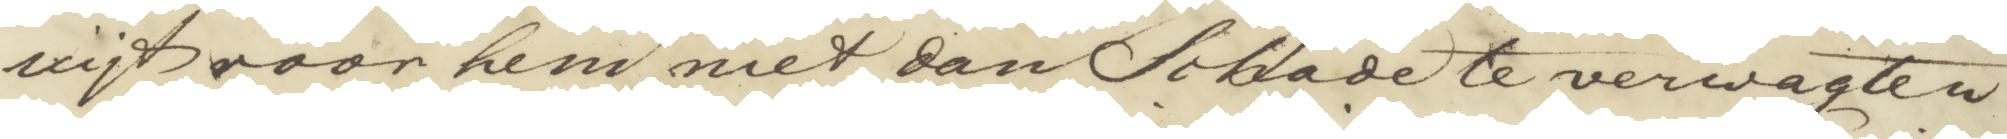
uijt voor hem niet den schade te verwagten
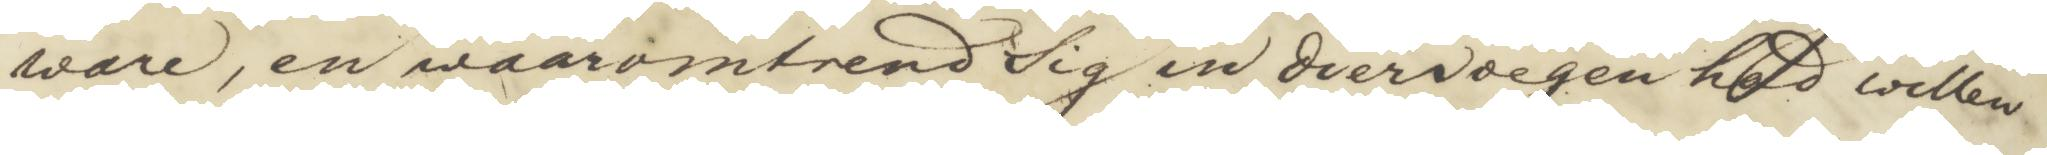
ware, en waaromtrend sig in diervoegen had willen
